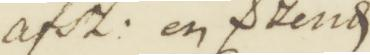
afsz: en verzenden
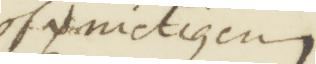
of vernietigen
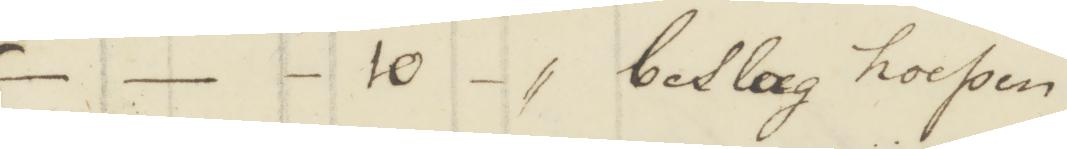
— — — 10 — „ beslag hoepen
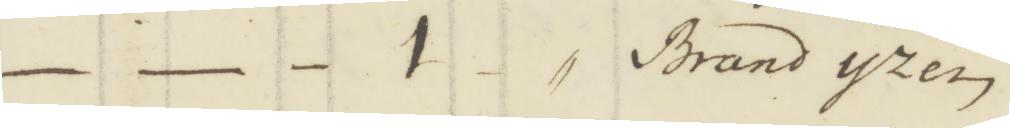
— — — 1 — „ Brand ijzer
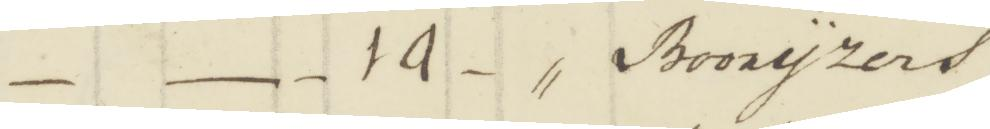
— — — 14 — „ Boorijzers
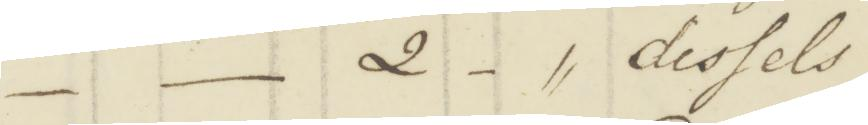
— — 2 — „ dessels
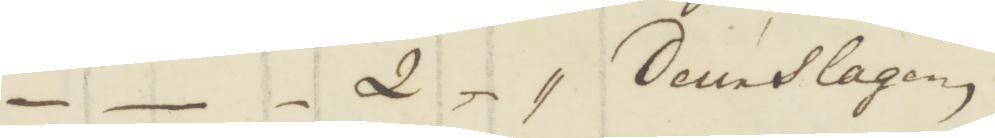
— — — 2 — „ deurslagen
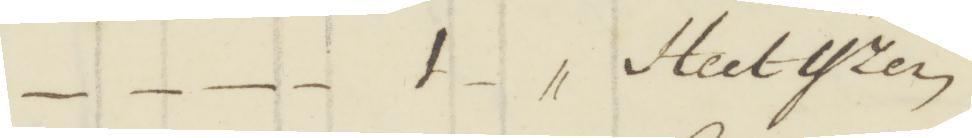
— — — — 1 — „ Heet yzer
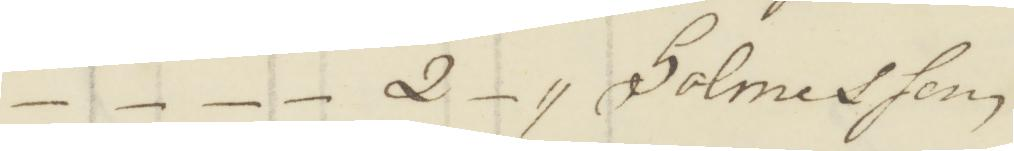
— — — — 2 — „ Holmessen
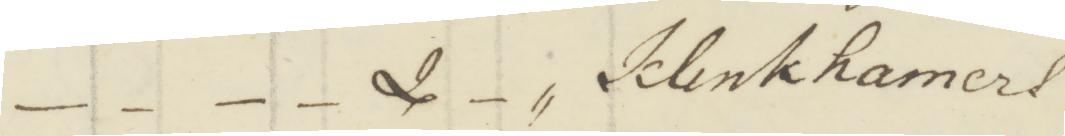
— — — — 2 — „ Klinkhamers
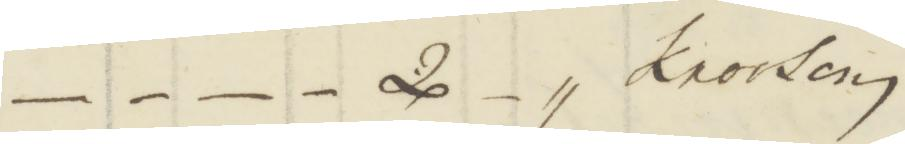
— — — — 2 — „ kroesen
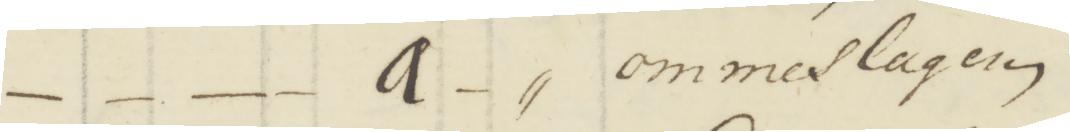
— — — — 4 — „ ommeslagen
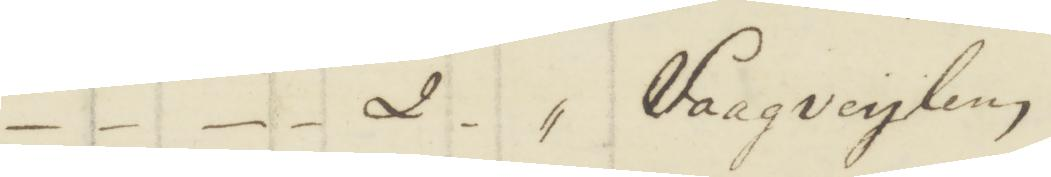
— — — — 2 — „ Vaagveijlen
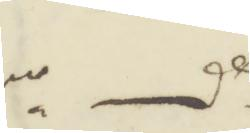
„ _„o
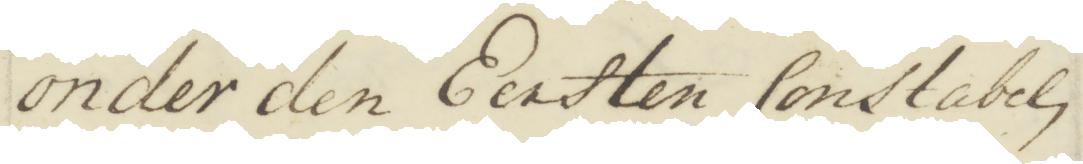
onder den Eersten Constabel
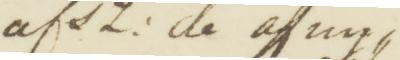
afsz: de affuij„
